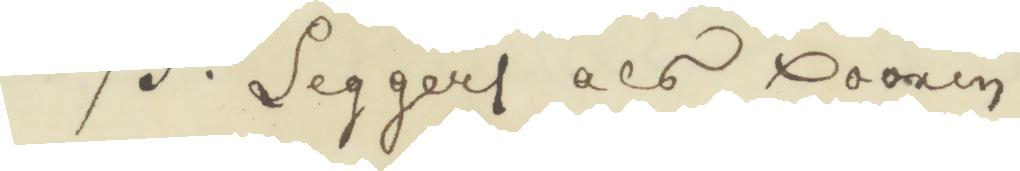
75. Leggers als vooren
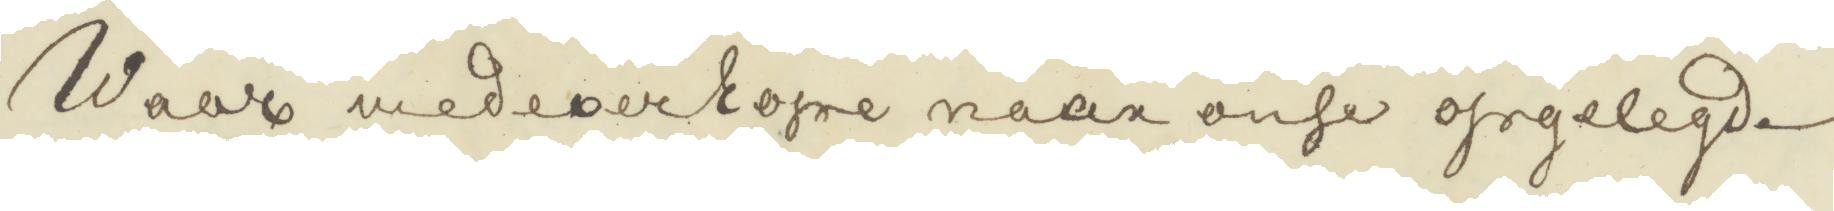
waar medeverhope naar onse opgelegde
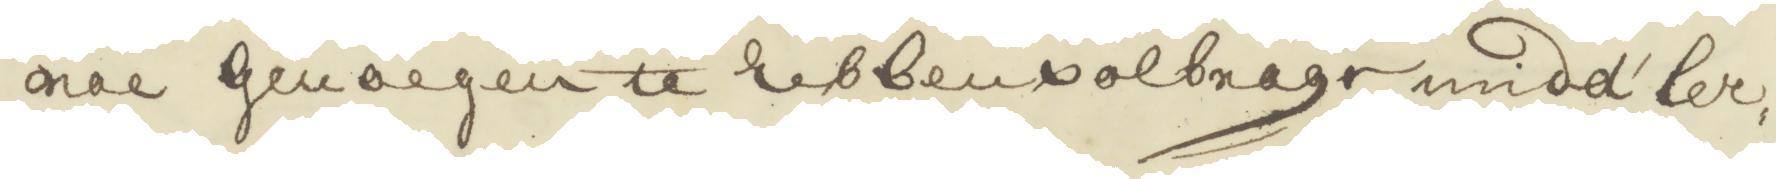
nae genoegen te hebben volbragt midd' ler„
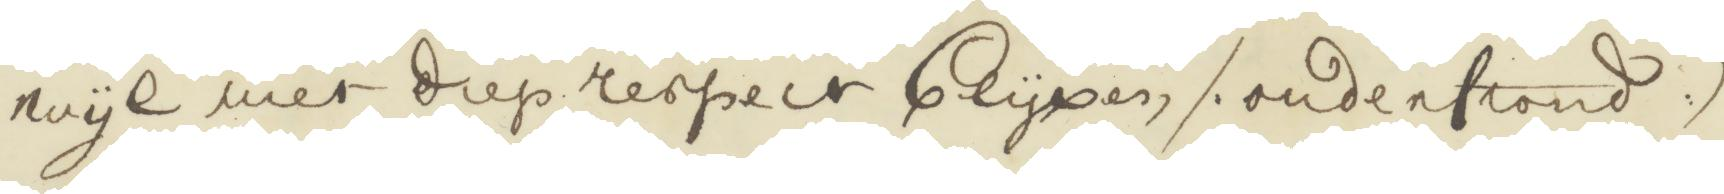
wijl met diep respect blijven /.onderstond:)
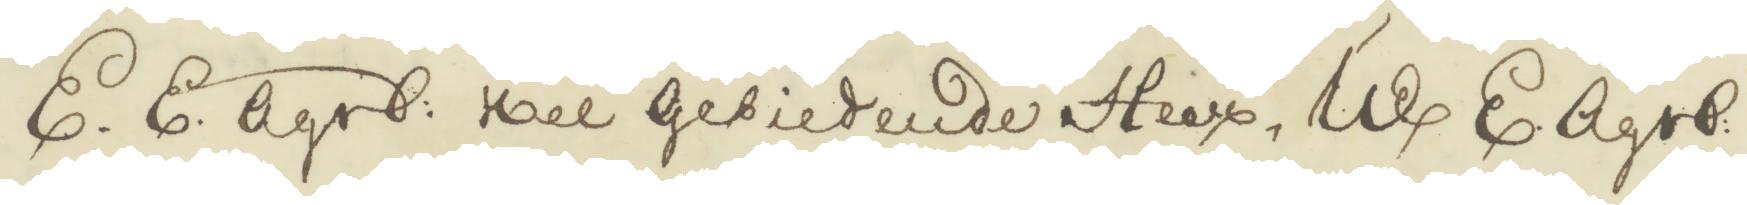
E. E: agtb: wel gebiedende Heer, UE E Agtb:
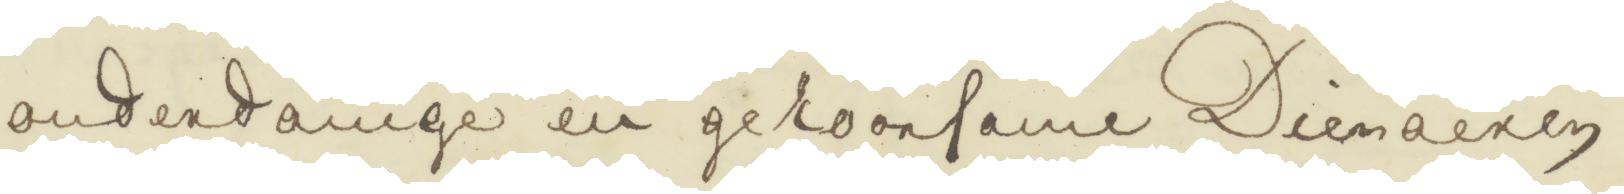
onderdanige en gehoorsame Dienaeren
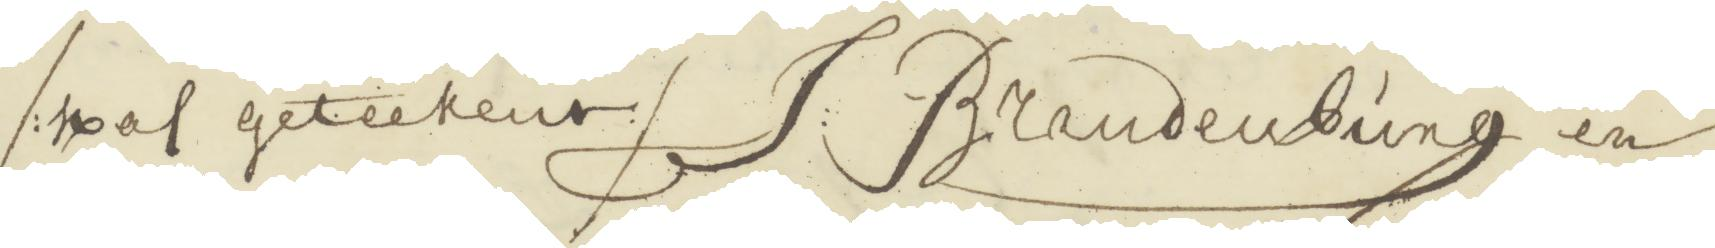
/:was geteekent:/ J: Brandenburg en
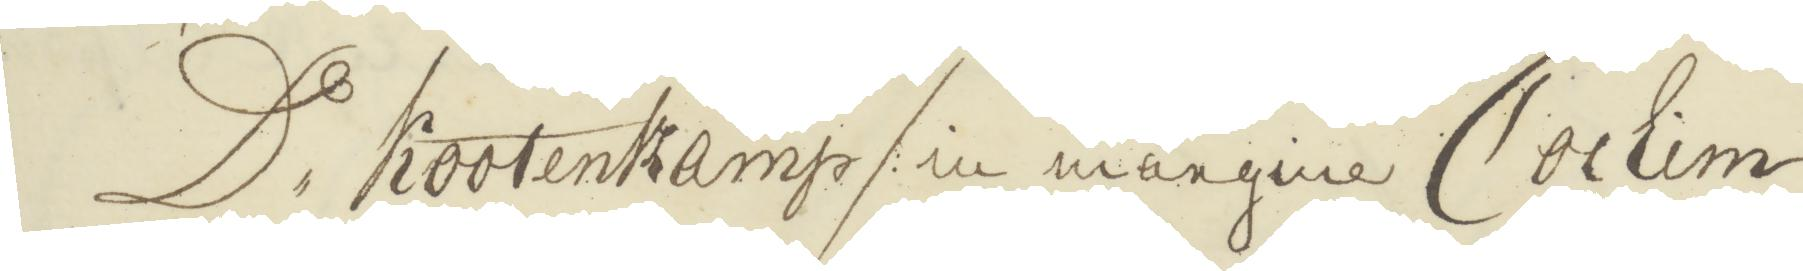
D„c Kootenkamp /: in margine Cochim
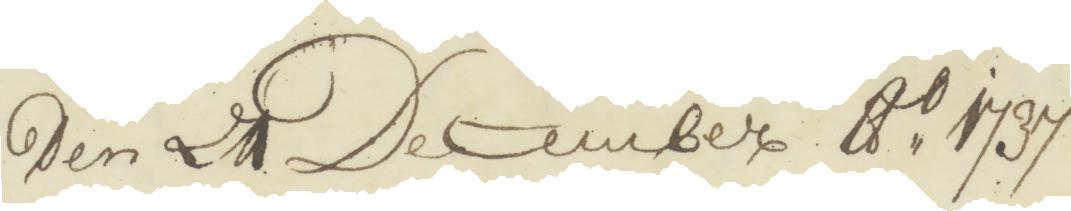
den 24 December A„o 1737
